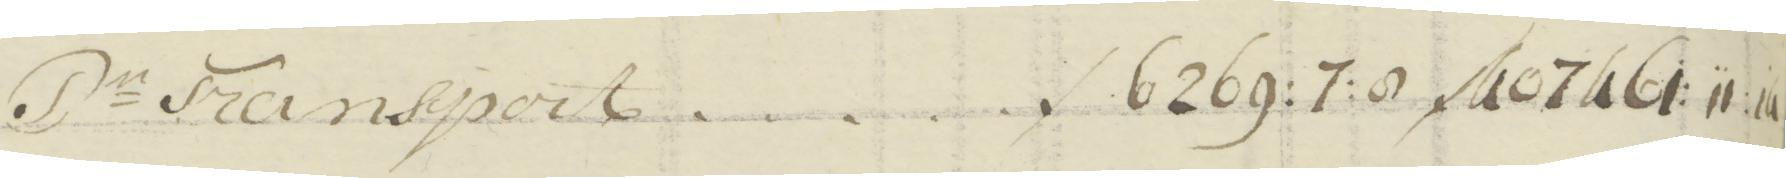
P=r Transport ƒ:6269:7:8 ƒ407461:11:14
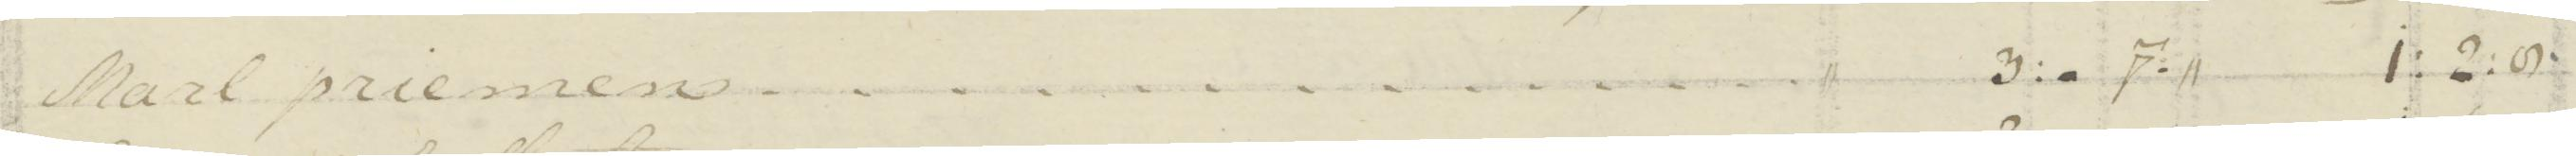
Marl priemen - - - - - - - - - - - - - - „ 3: - p=s „ 1: 2: 8.
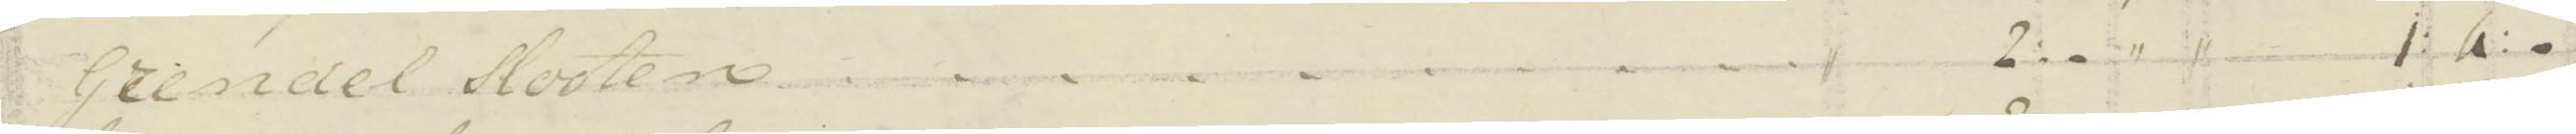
Grendel slooten - - - - - - - - - - „ 2: - „ „ 1: 4: -
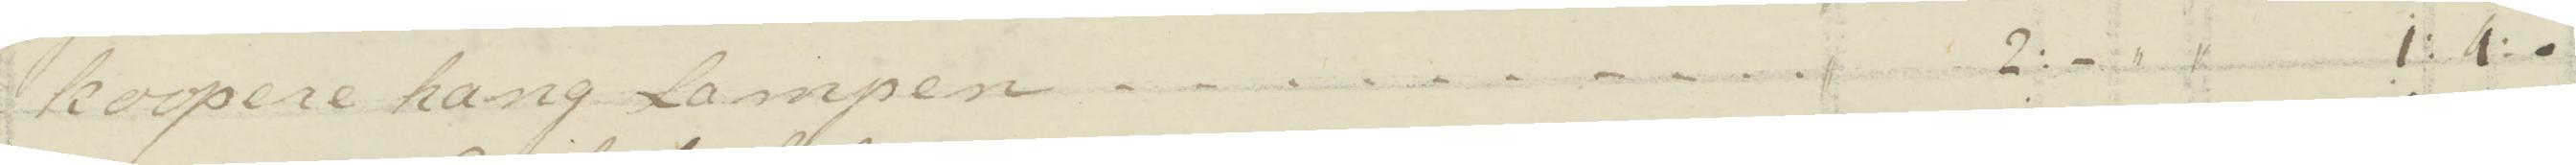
koopere hang Lampen - - - - - - - - - - „ 2: -„ „ 1: 4: -
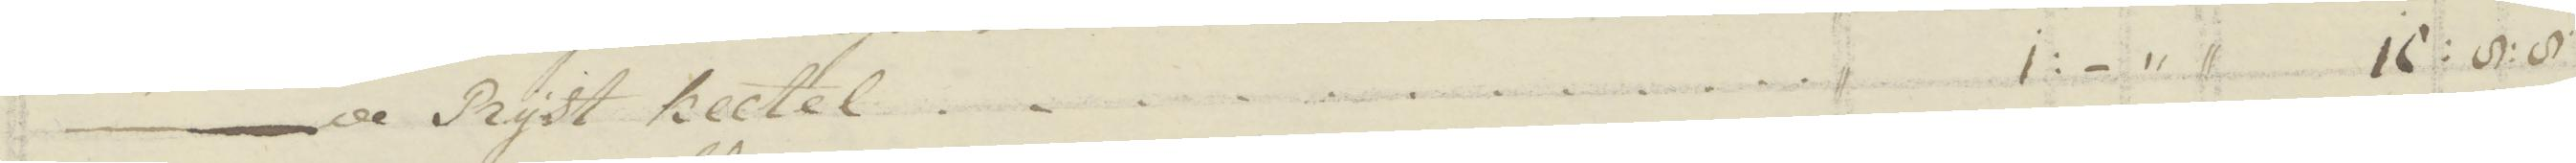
_o Rijst keetel - - - - - - - - - - - - „ 1: - „ „ 15: 8: 8
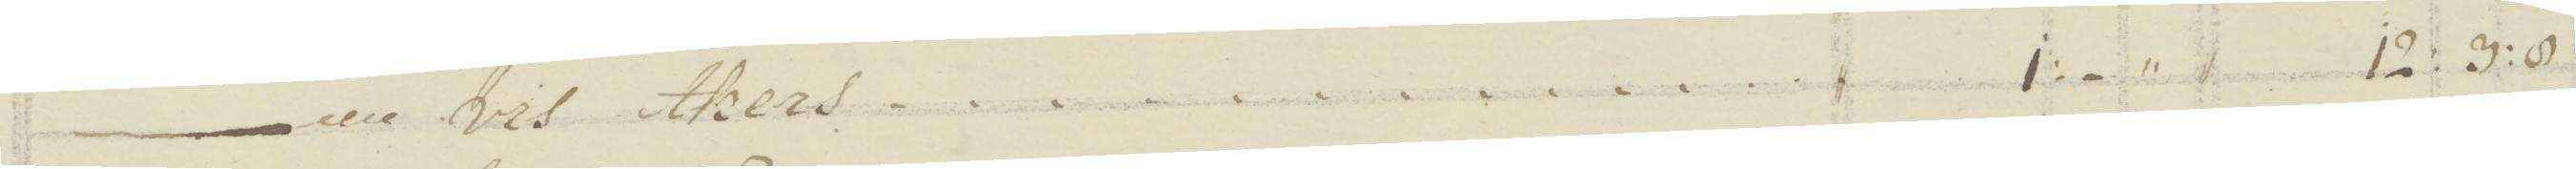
_o vis Akers - - - - - - - - - - - - - „ 1:- „ „ 12: 3: 8
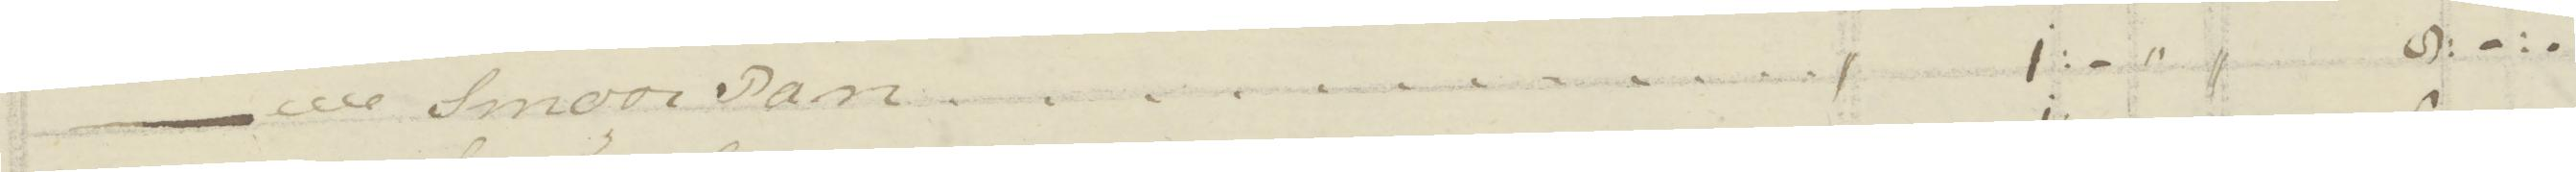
_o smoor Pan - - - - - - - - - - - - 1: -„ „ 8: -: -
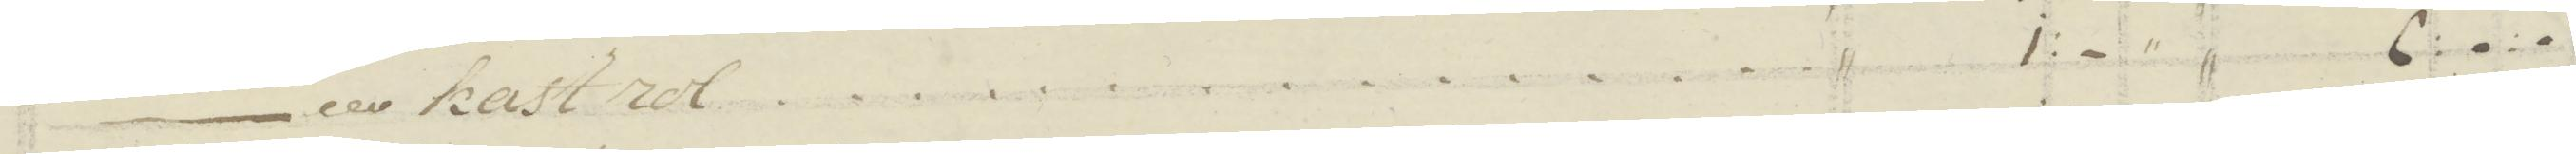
_o kast rol - - - - - - - - - - - - - - - „ 1: - „ „ 5: -: -
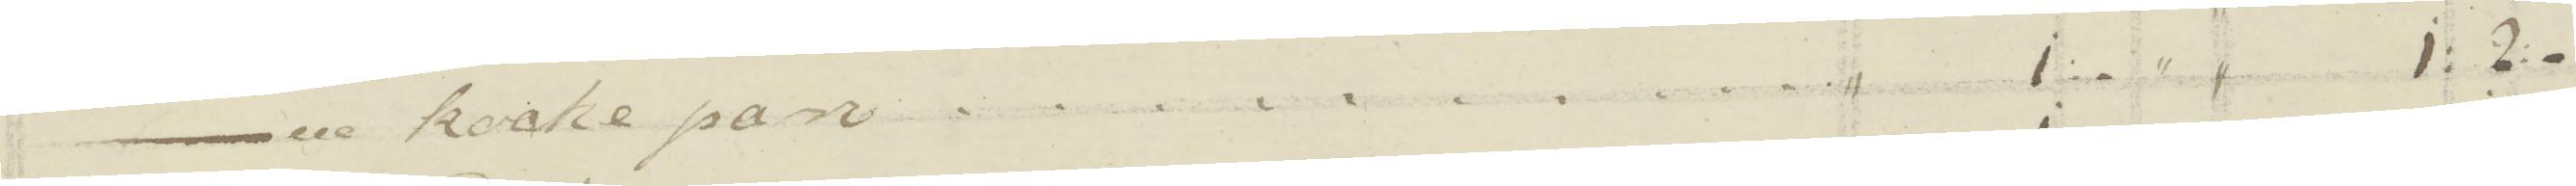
_o koeke pan - - - - - - - - - - „ 1: - „ „1: 2: -
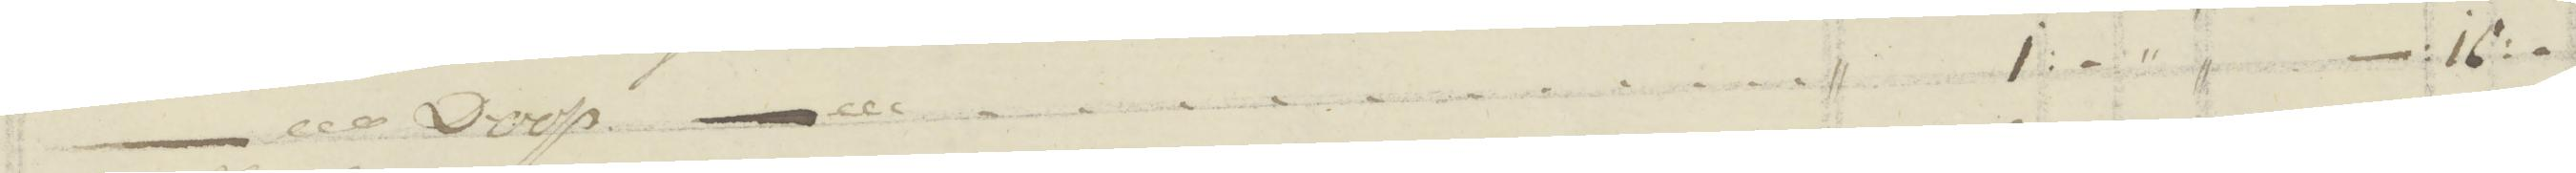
_o Doop _o - - - - - - - - - - - „ 1: - „ „ —:16: -
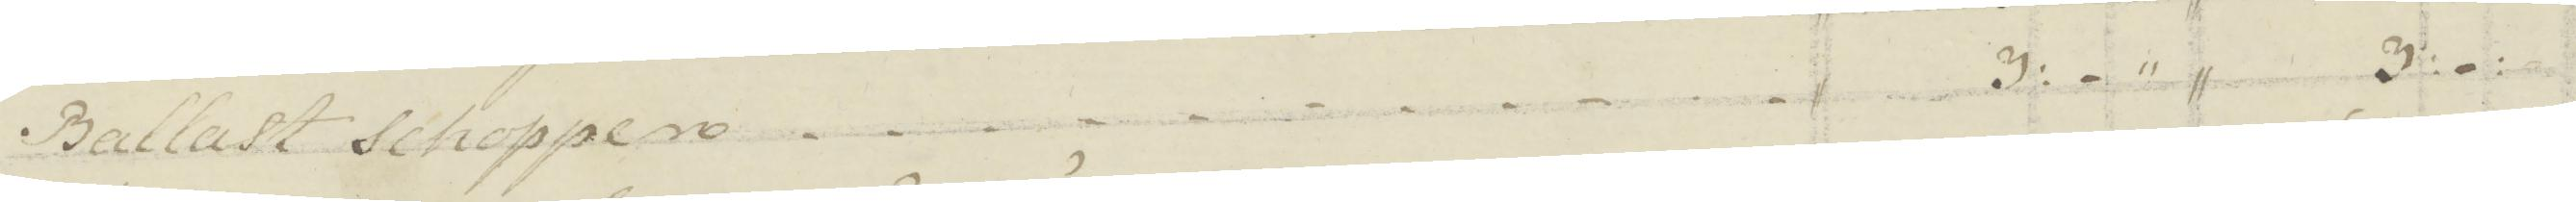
Ballast schoppen - - - - - - - - - - - „ 3: - „ „ 3: - :
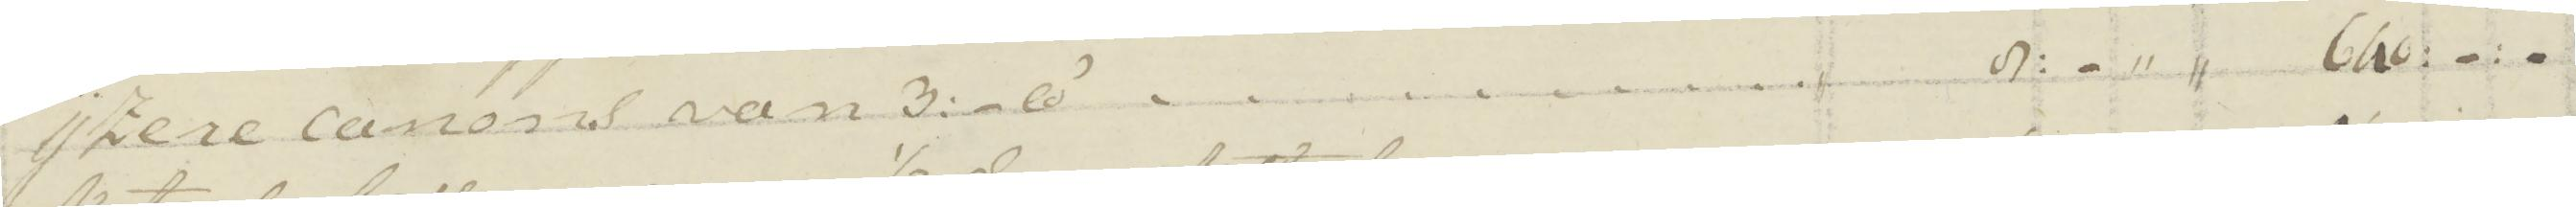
ijzere canons van 3:—lb - - - - - - - - - - „8: - „ „ 640: -: -
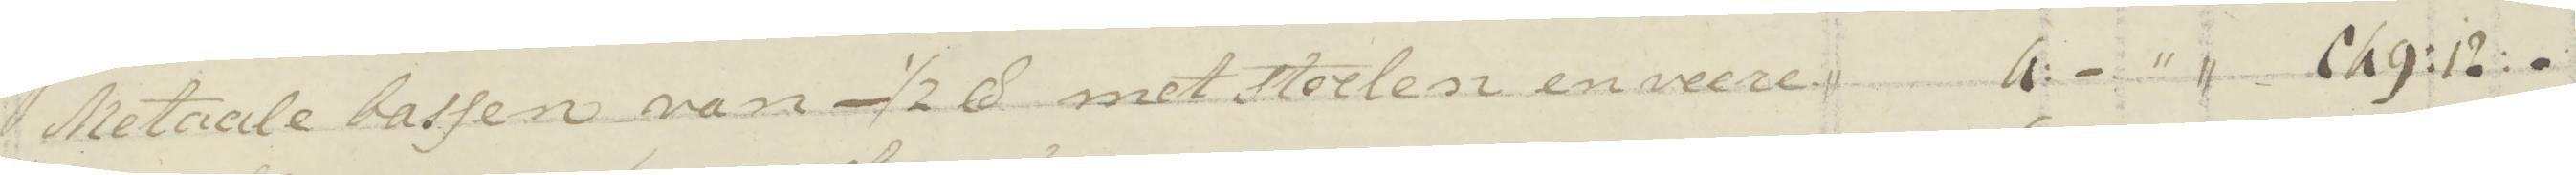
Metaale bassen van —1/2 lb met stoelen en veere „ 4: -„ „ 549:12: -
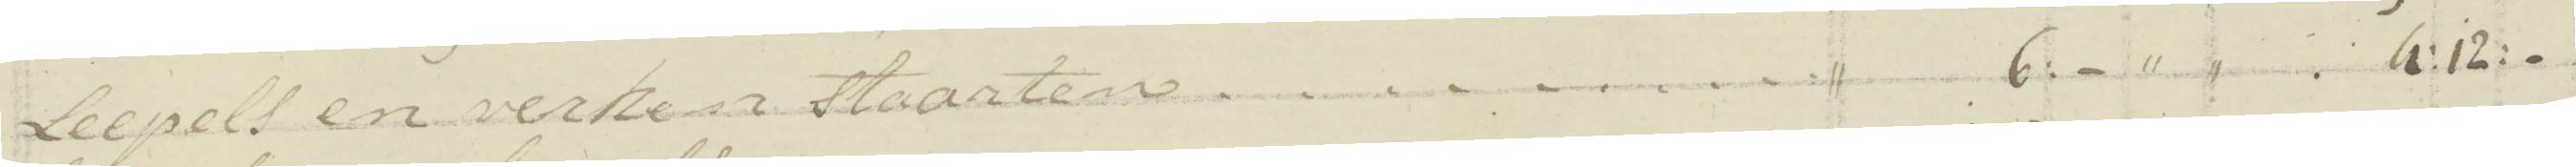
Leepels en verken staarten - - - - - - - - - - „ 6: -„ „ 4:12: -
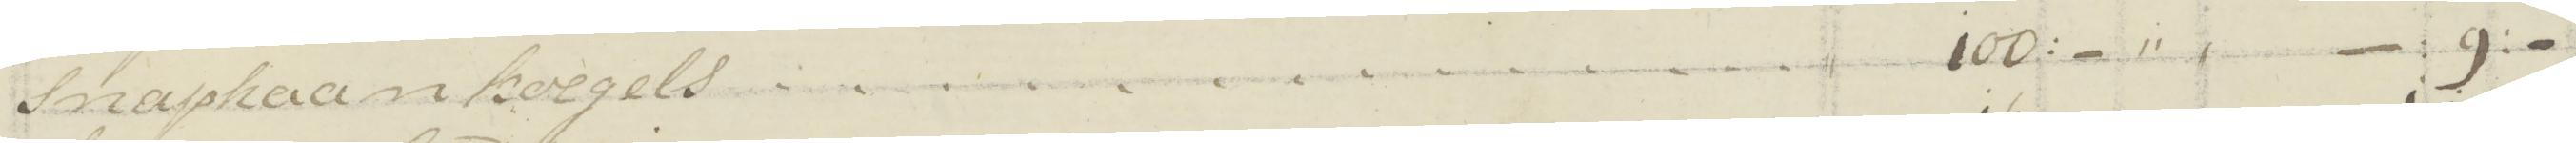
snaphaan koegels - - - - - - - - - - - - - - „ 100: -„ „ —: 9: -
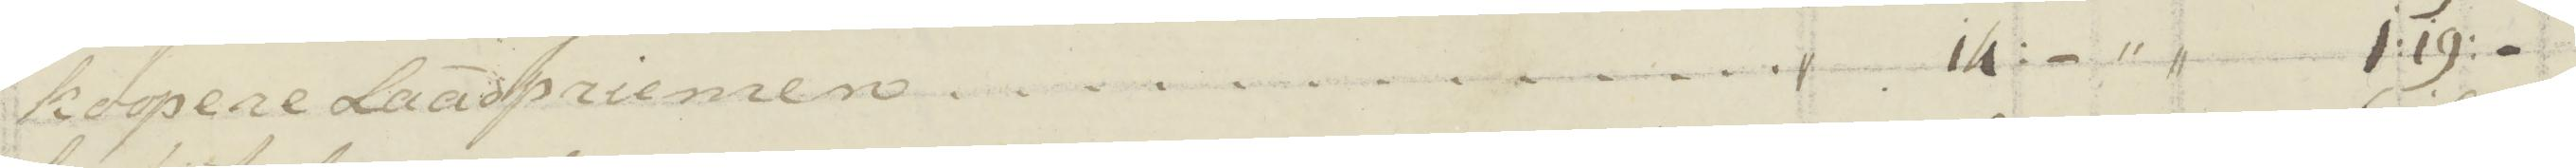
koopere Laadpriemen - - - - - - - - - - - - - „ 14: -„ „ 1:19: -
